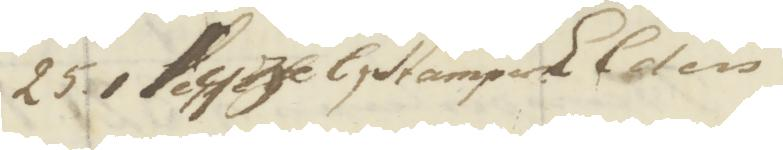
25. 1 leyzre Eystampers Elders
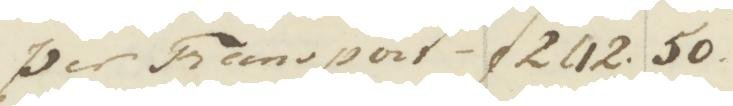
per Treensport - ƒ242. 50.
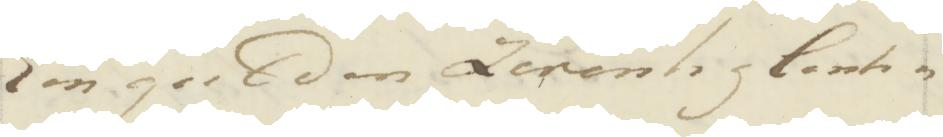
Een gulden Zeventeg Cent
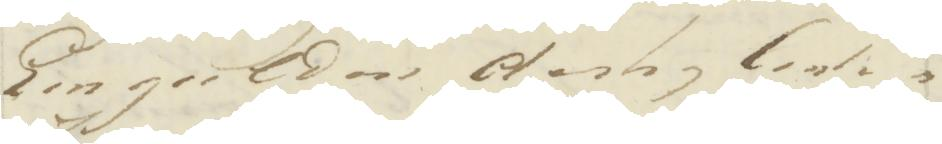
Een gulden dertig Cent „
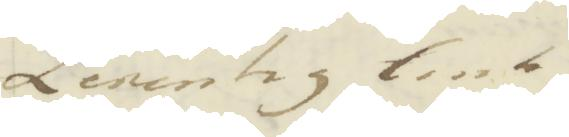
Zeventig Cent
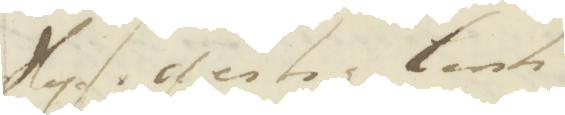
Vyfendertig Cents
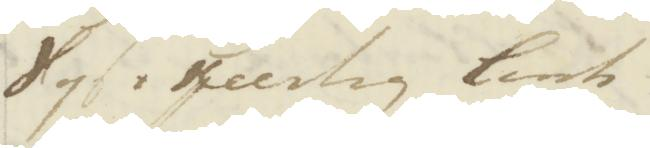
Vyfenveertig Cent
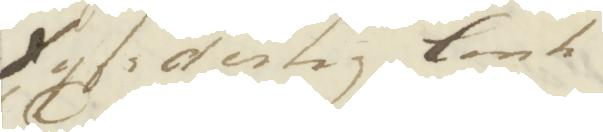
Vyfendertig Cent
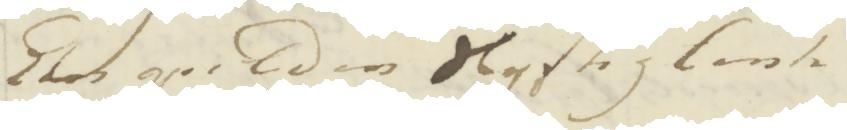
Een gulden Vyftig Cent
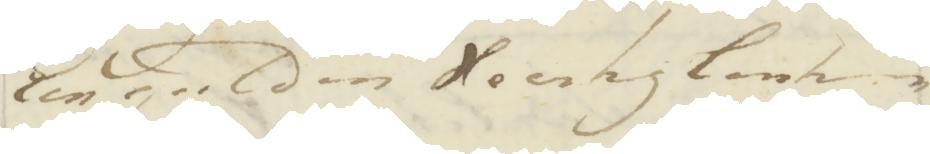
Een gulden veertig Cent
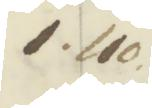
1. 100
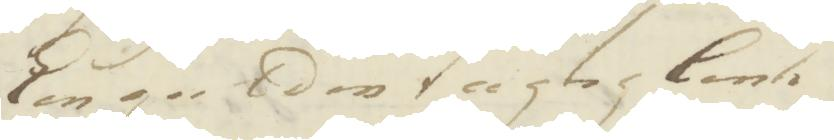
Een gulden tagtig Cent
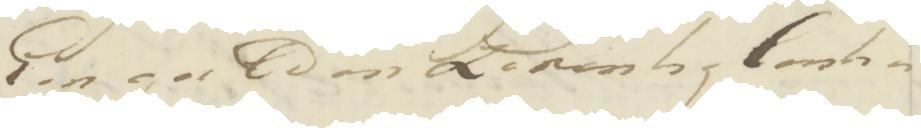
Een gulden zeventig Cent
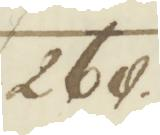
268.
